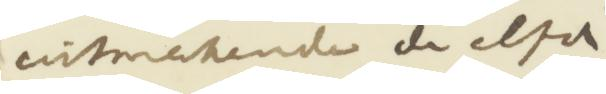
uitmakende de elfde
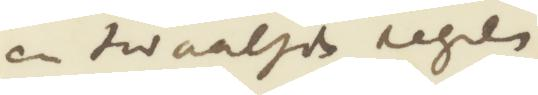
en twaalfde regels
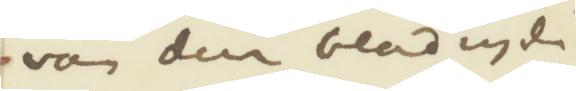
van den bladzyde
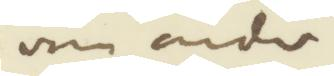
van onder
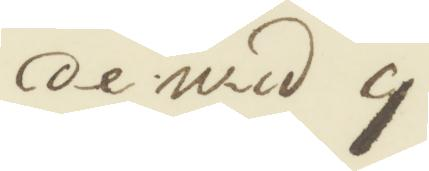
de wed q
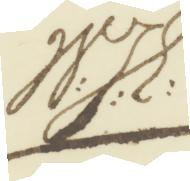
W: J. E:
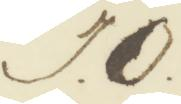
I.O
